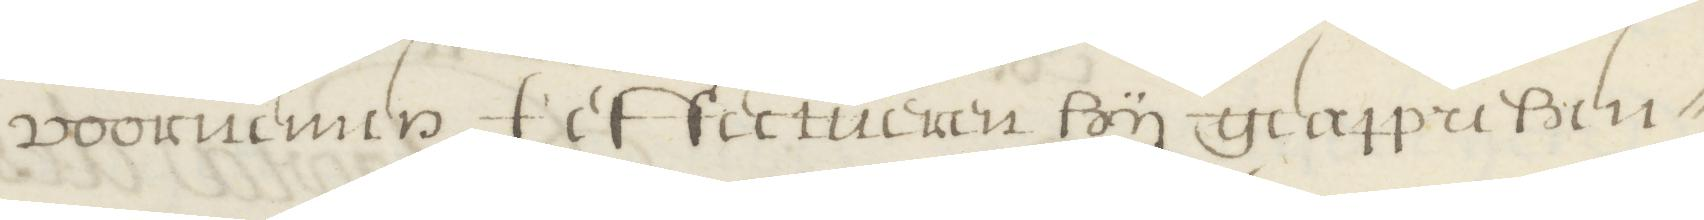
voornemen t'effectueren hij geapprehen„
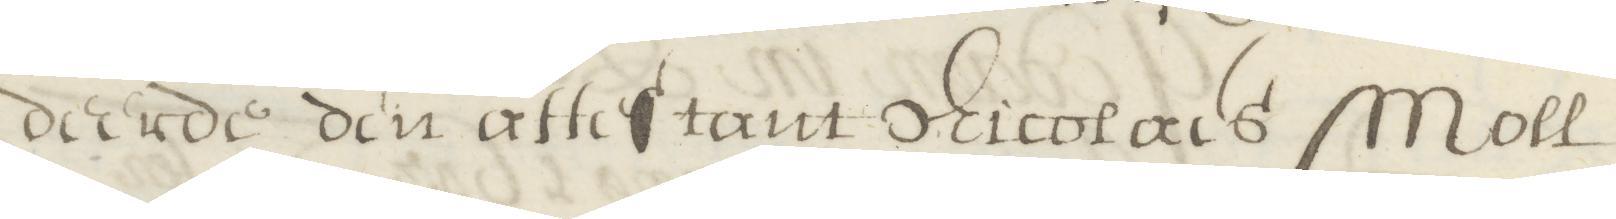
deerde den attestant Nicolaes Moll
